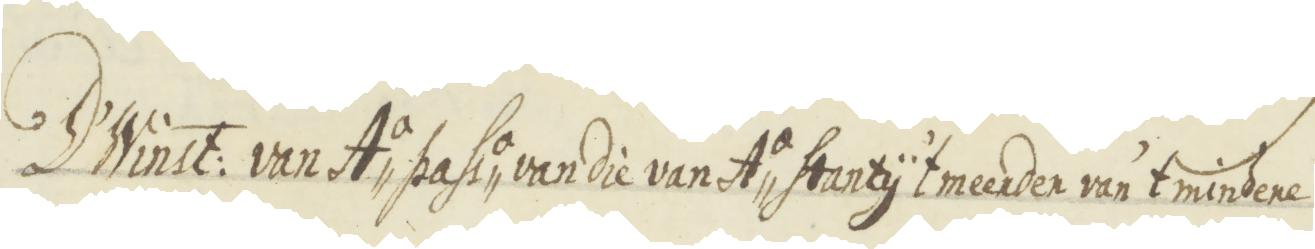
D'Winst: van A„o pass„o van die van A„o stantij ’t meerder van ’t mindere
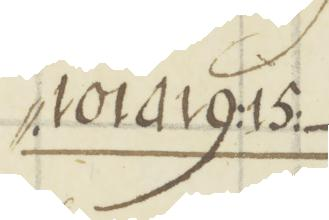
„101419:15:_
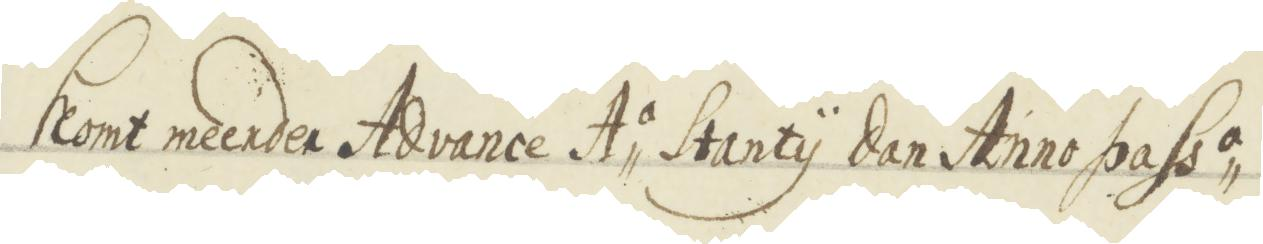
Komt meerder Advance A:o stantij dan Anno pass„o
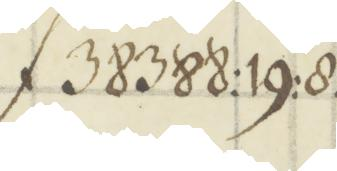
ƒ38388:19.8.
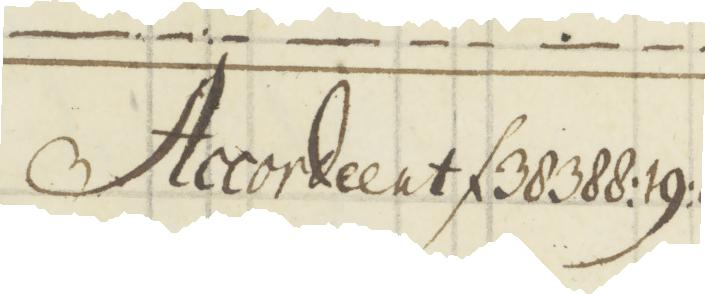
Accordeert ƒ 38388:19:8.
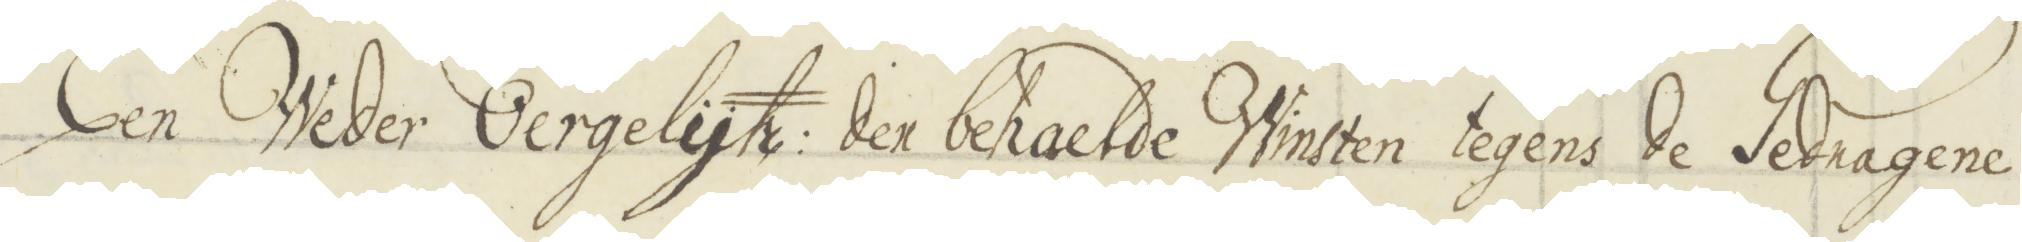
Een Weder Vergelijk: der behaelde winsten tegens de Gedragene
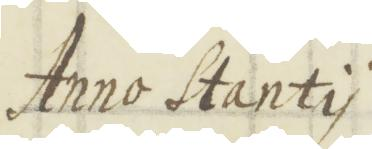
Anno stantij
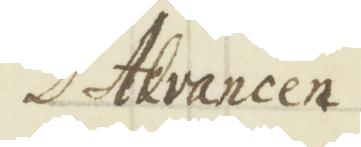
D’Advancen
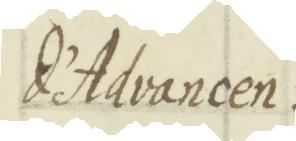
d’Advancen:
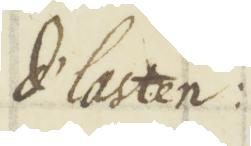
d’ lasten:
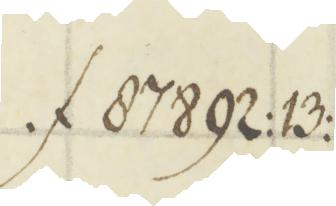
ƒ87892:13:-
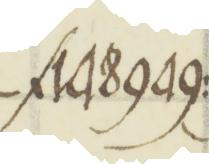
ƒ148949:9:8
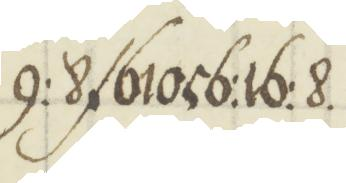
ƒ61056.16.8.
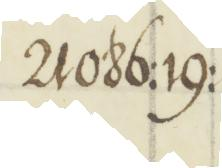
21086:19:8.
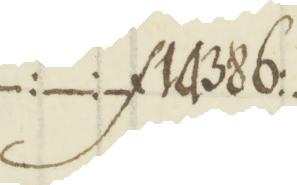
_:_:_ „ 538:19:_.
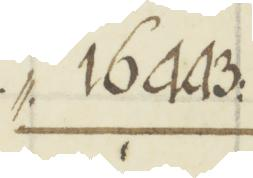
„ 16443:2:_„.
